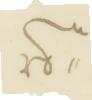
rd„
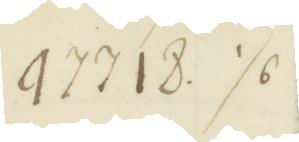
47718. 1/6
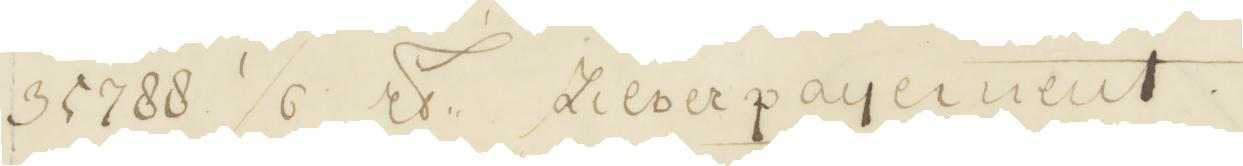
35788.1/6 rd„s zilver payement.
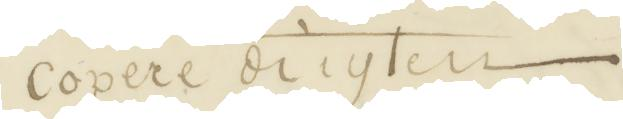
copere duyten
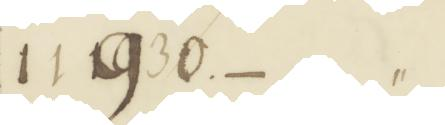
111930._ „
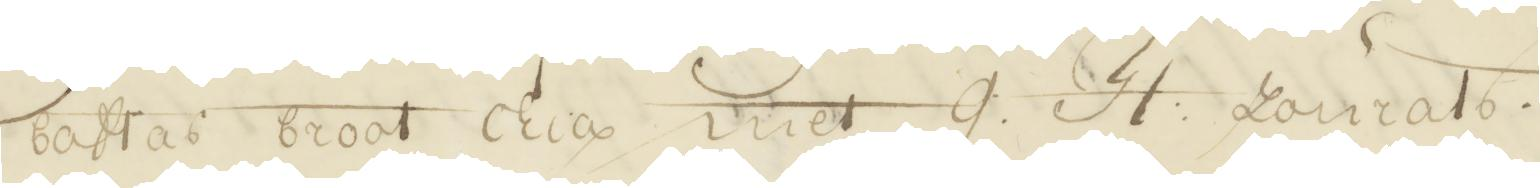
baftas broot chia met 9. ht: zourats.
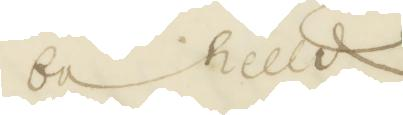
ba heeld
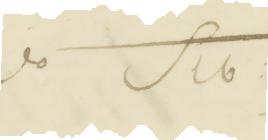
_o Su
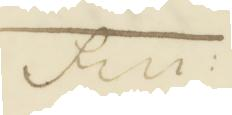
sm:
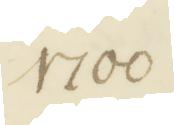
1700
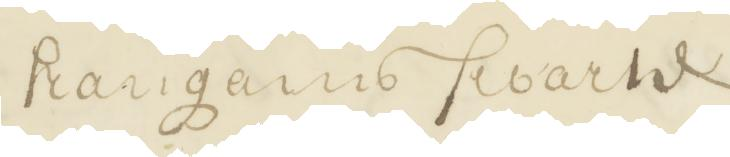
kangams Swarte
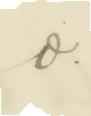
d.
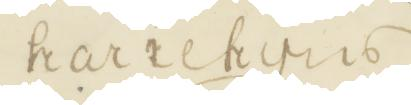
karrekyns
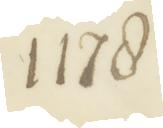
1178
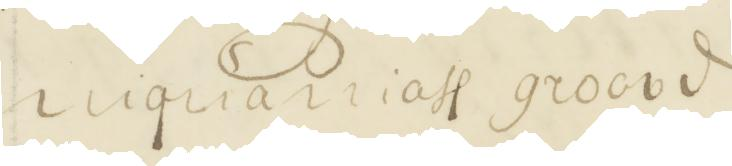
niquaniass groove
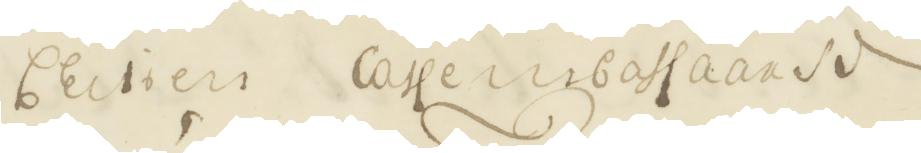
chijsen cass embassaarse
